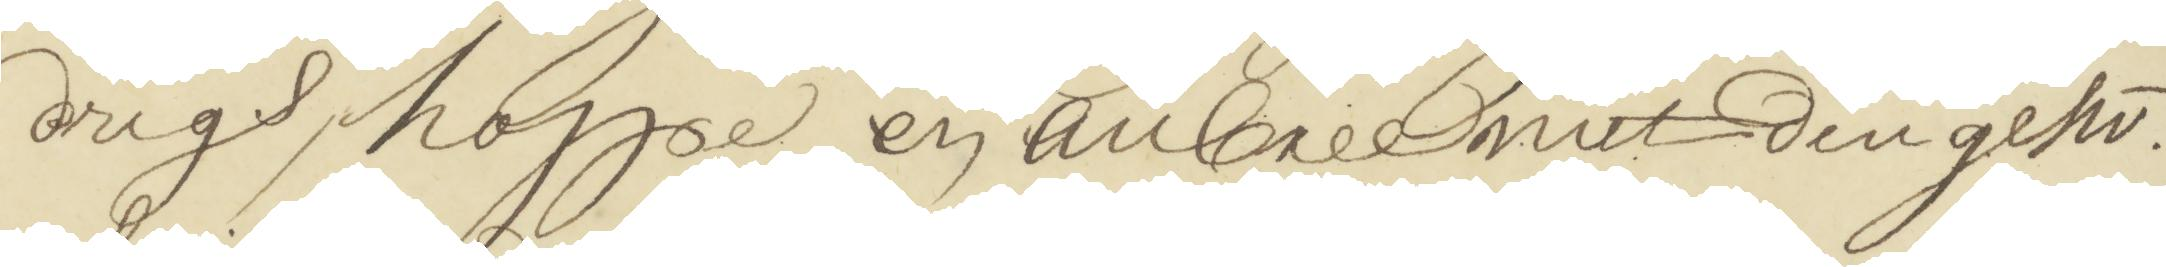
drigs, hoppe en aubree met den gesw
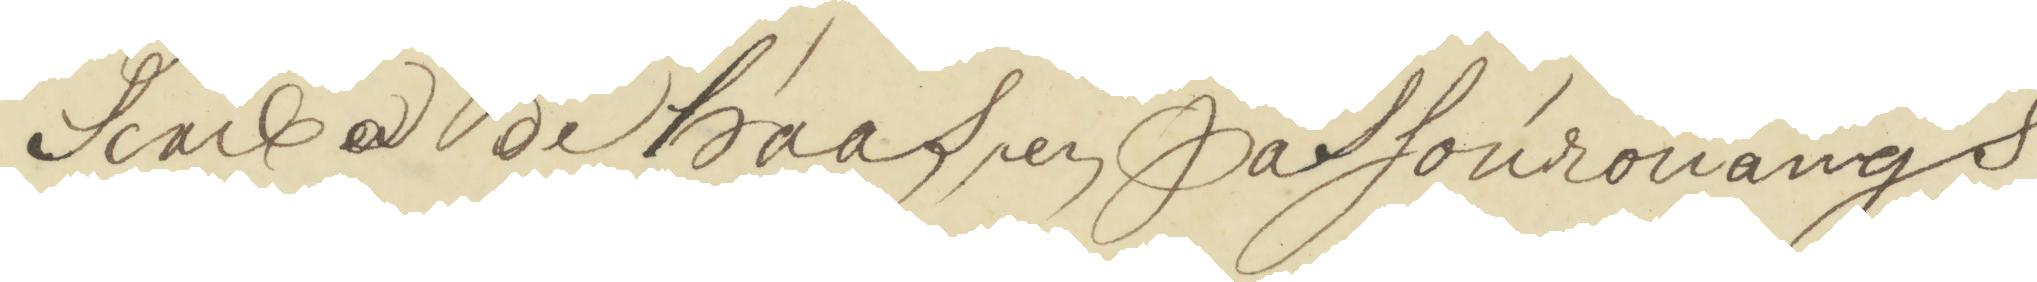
scriba de haas, en passourouangs
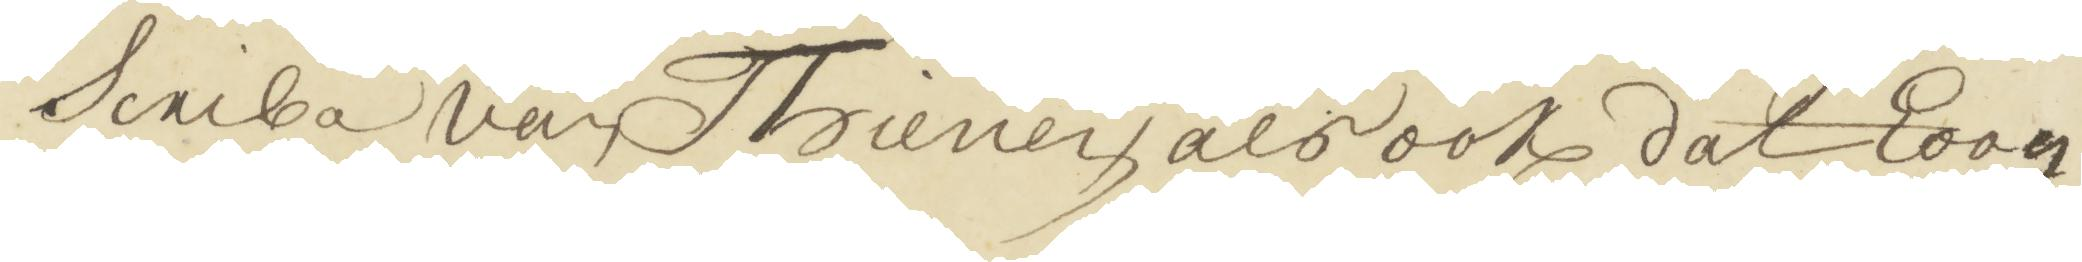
scriba van Thienen, als ook dat hoog
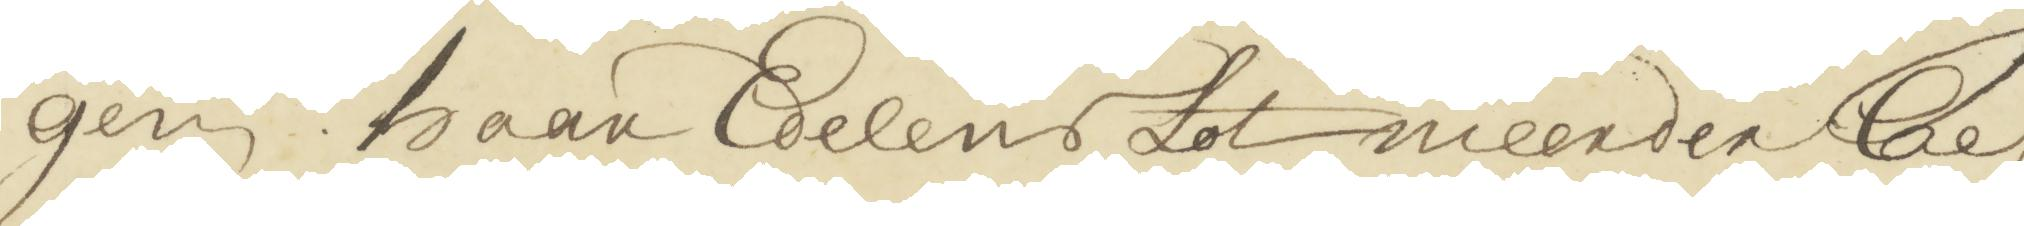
gem: haar Edelens tot meerder be
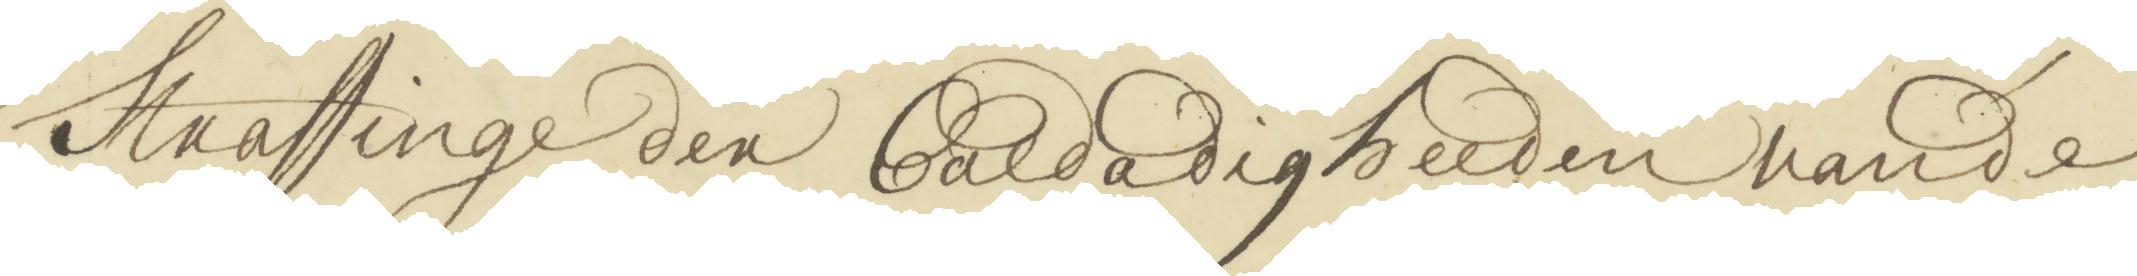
straffinge der baldadigheeden van de
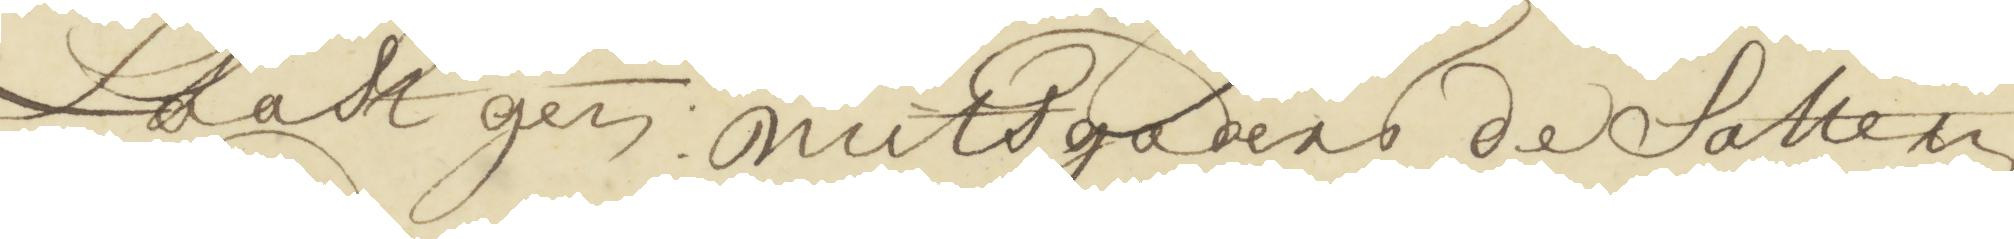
Laast gem: mitsgaders de satte in
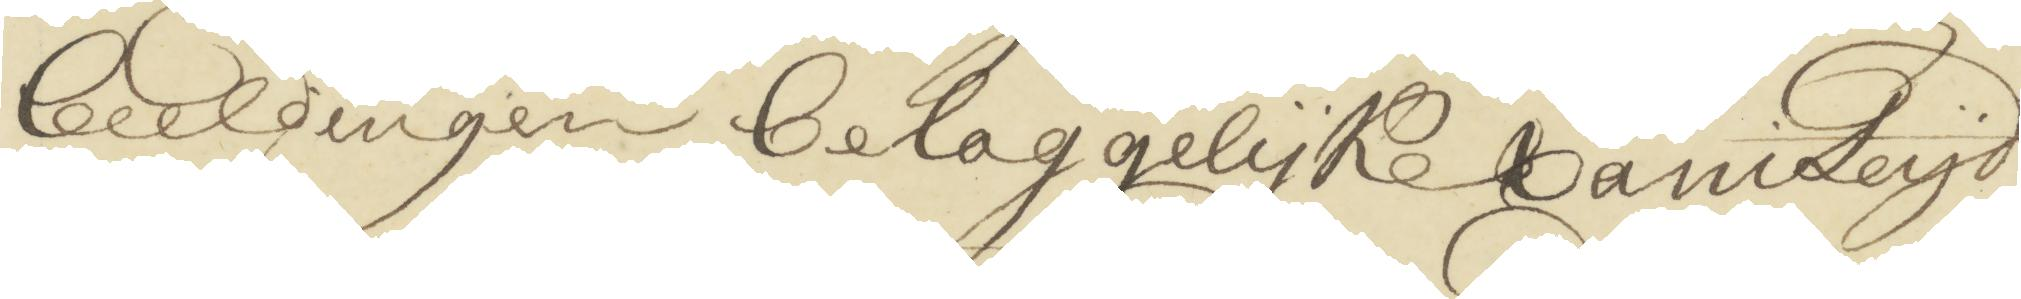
beeldingen, belaggelijke vaniteijd
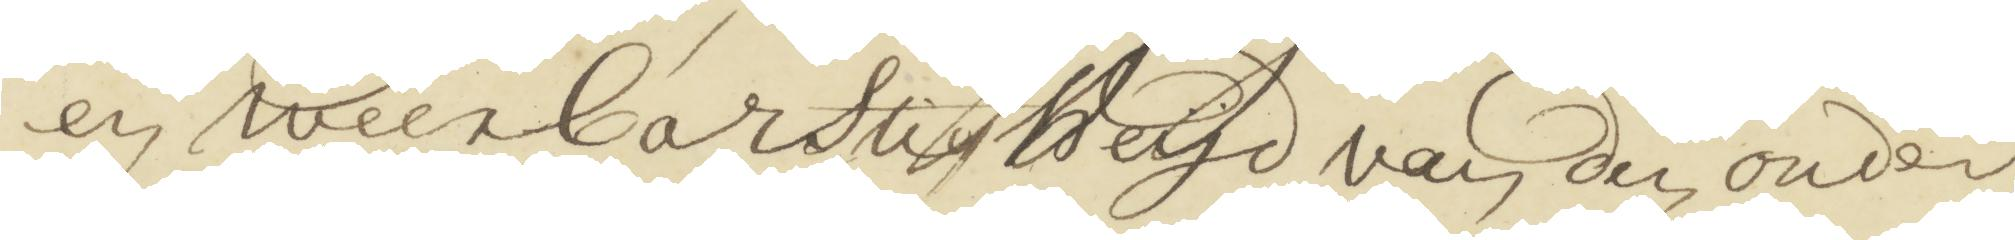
en weerbarstigheijd van den onder
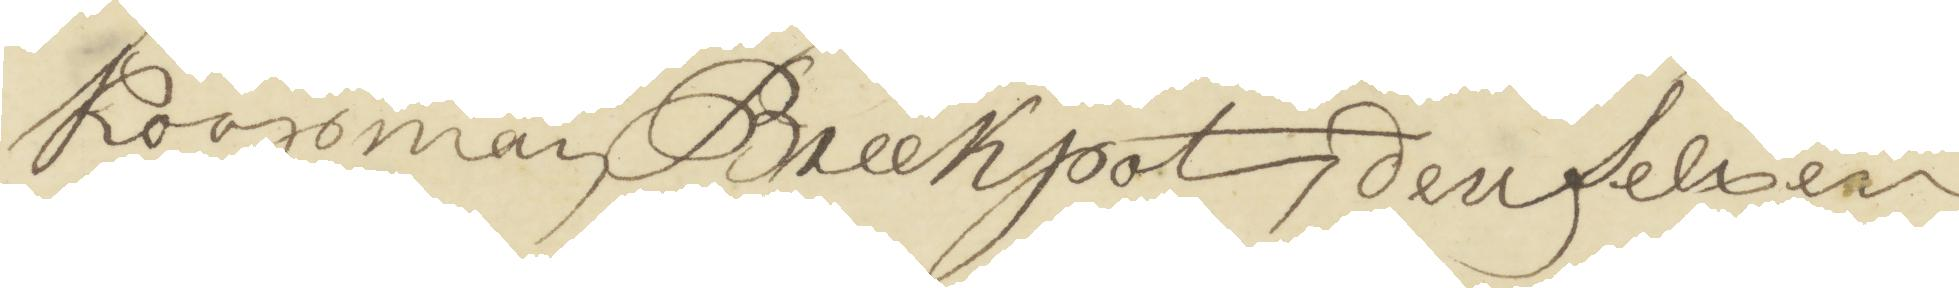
Koopman Breekpot denselven
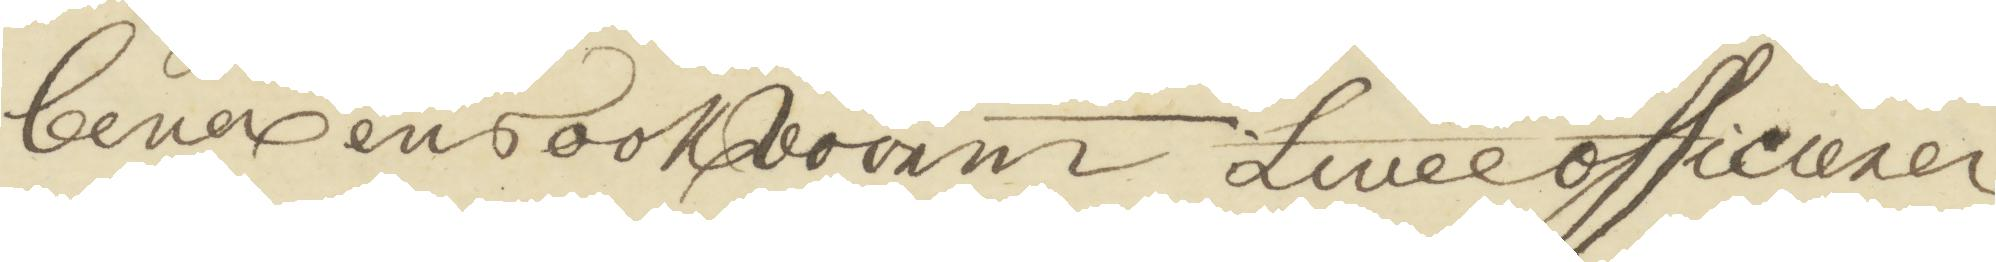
benevens ook voorm twee officieren
